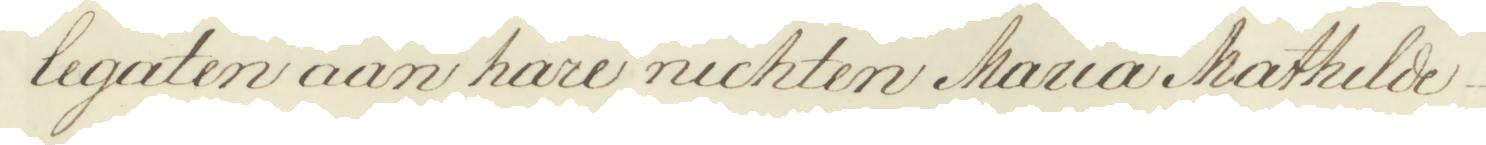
legaten aan hare nichten Maria Mathilde
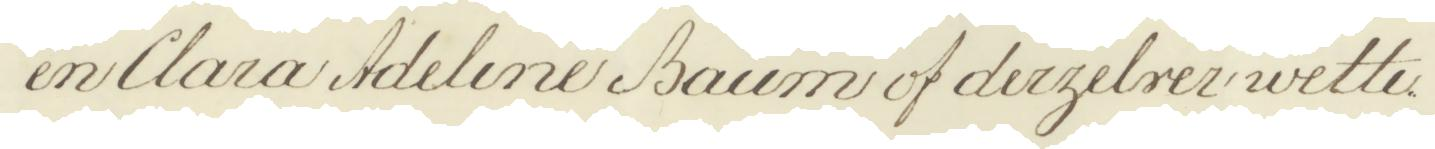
en Clara Adeline Baum of derzelver wetti„
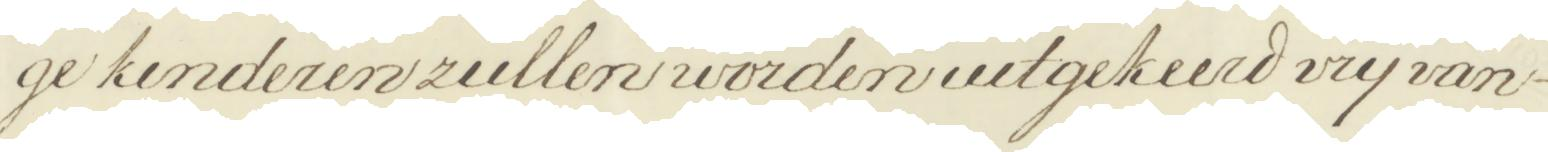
ge kinderen zullen worden uitgekeerd vry van
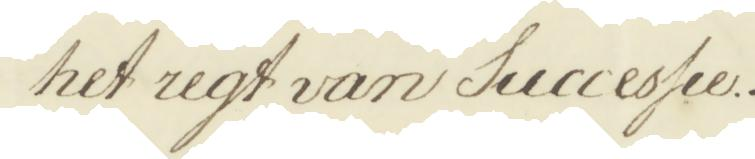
het regt van Successie.
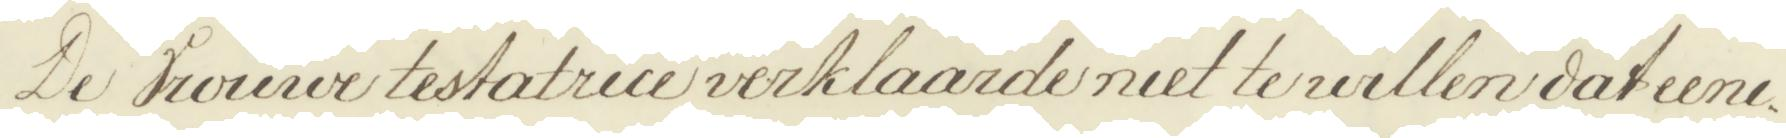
De Vrouwe testatrice verklaarde niet te willen dat eeni„
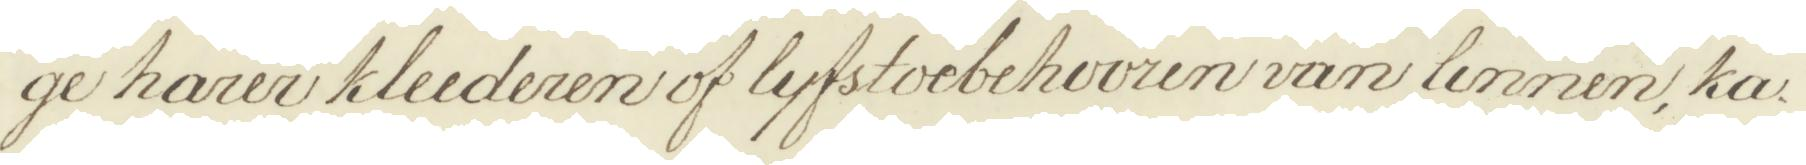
ge harer kleederen of lyfstoebehooren van linnen, ka„
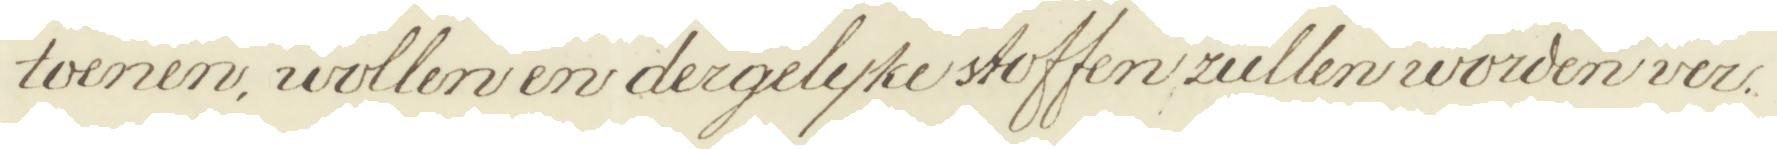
toenen, wollen en dergelyke stoffen zullen worden ver„
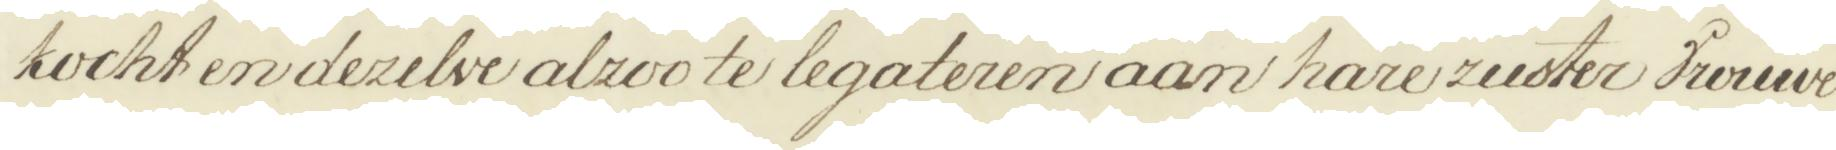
kocht en dezelve alzoo te legateren aan hare zuster Vrouwe
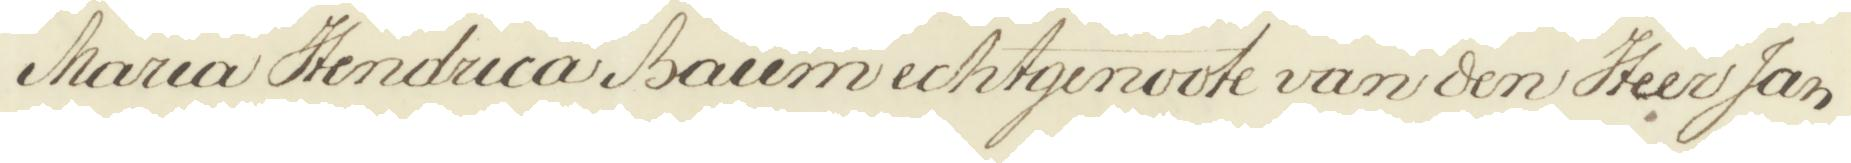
Maria Hendrica Baum echtgenoote van den Heer Jan
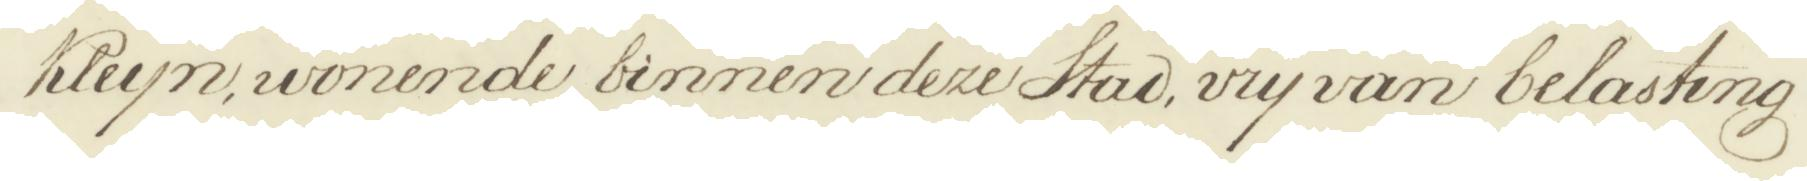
Kleyn, wonende binnen deze Stad, vry van belasting
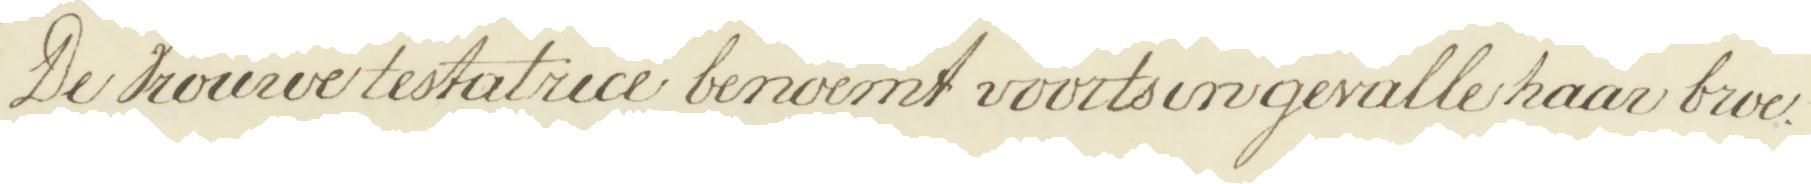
De Vrouwe testatrice benoemt voorts in gevalle haar broe„
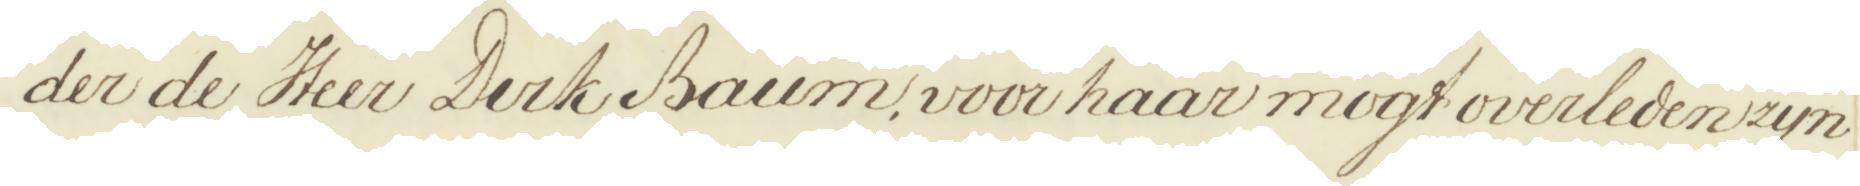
der de Heer Derk Baum, voor haar mogt overleden zyn
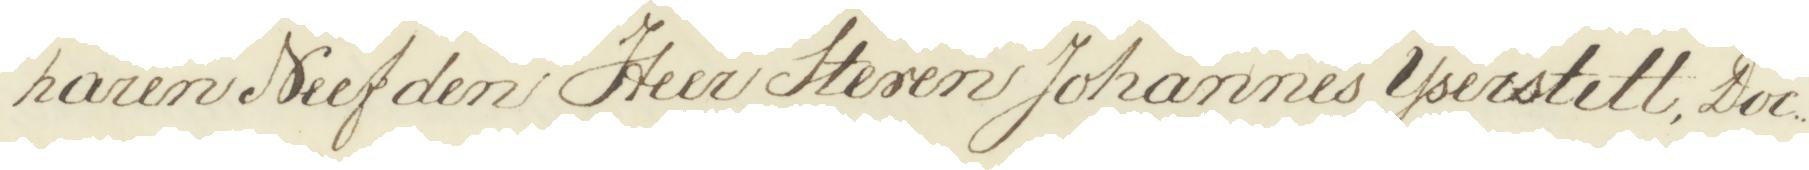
haren Neef den Heer Steven Johannes Yserstitt, Doc„
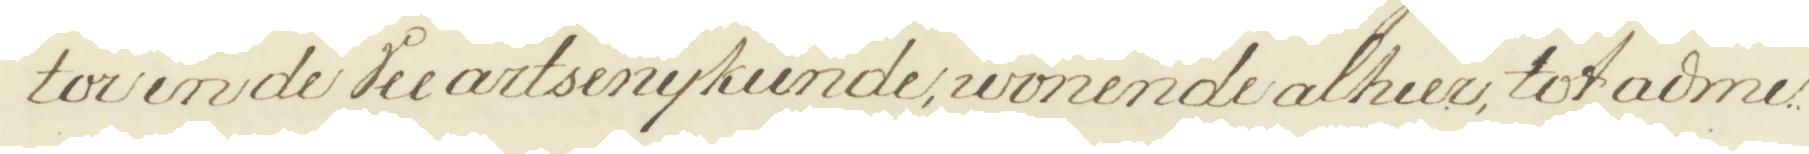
tor in de Veeartsenykunde, wonende alhier, tot admi„
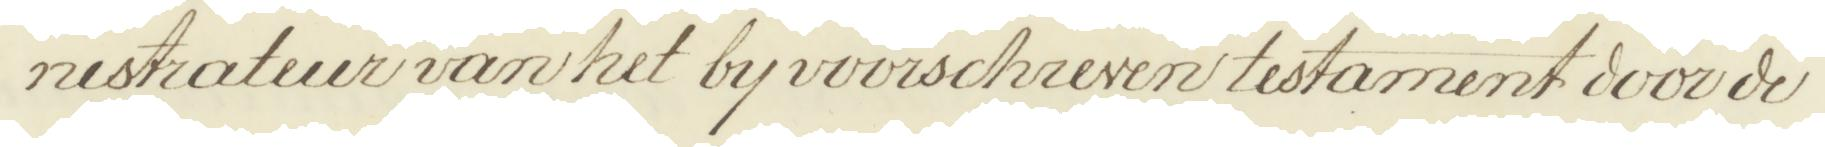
nistrateur van het by voorschreven testament door de
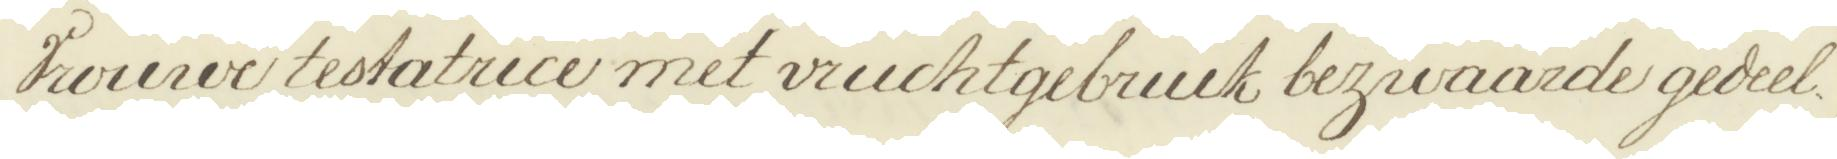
Vrouwe testatrice met vruchtgebruik bezwaarde gedeel„
